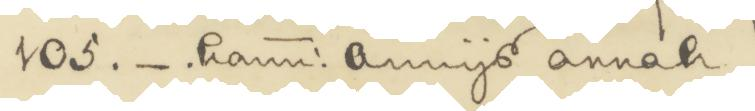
105.—. kann: annijs arrak
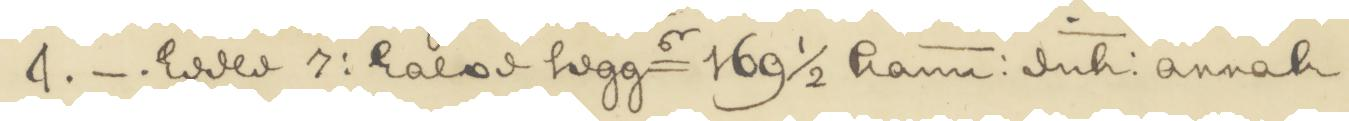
4.—. heele 7: halve legg=s 169½ kann: enk: arrak
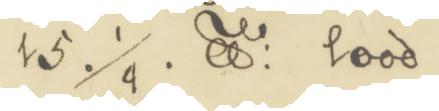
15.¼. lb: lood
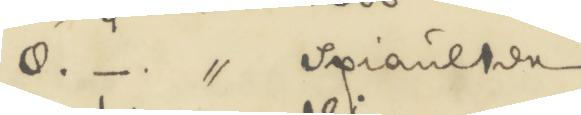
8. —. „ spiaulter
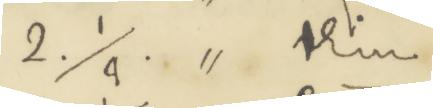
2.¼. „ thin
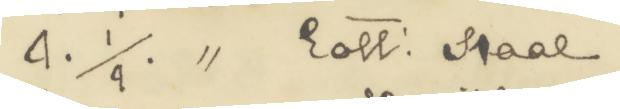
4.¼. „ holl: staal
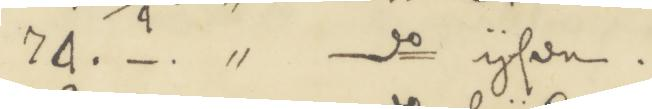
74.—. „ _=o ijser
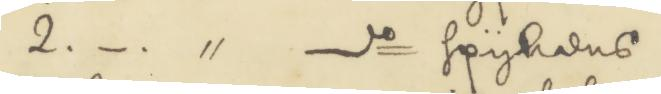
2.—. „ _=o spijkers
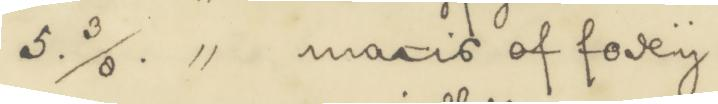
5.3/8. „ macis of foelij
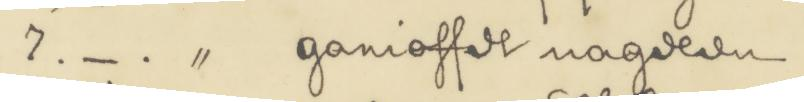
7.—. „ garioffel nagelen
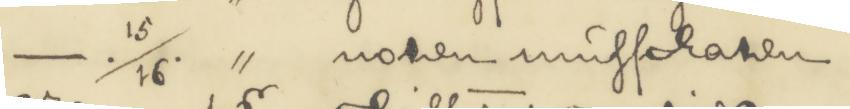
— .15/16. „ noten musschaten
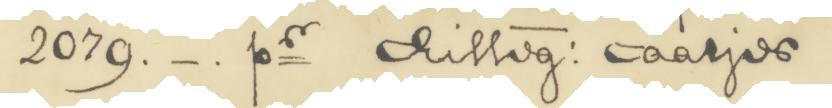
2079.—. p=s chilleg: caatjes
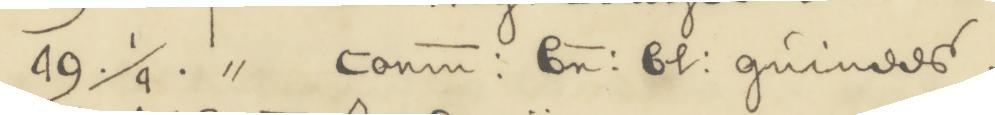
49.¼. „ corm: br: bl: guinees
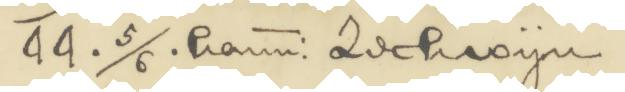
44.5/6. kann: zeckwijn
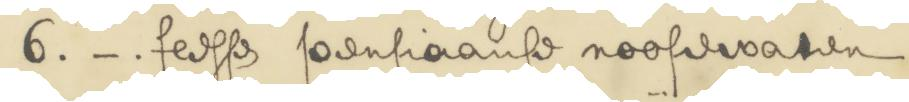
6.—. flessen persiaanse roosewater
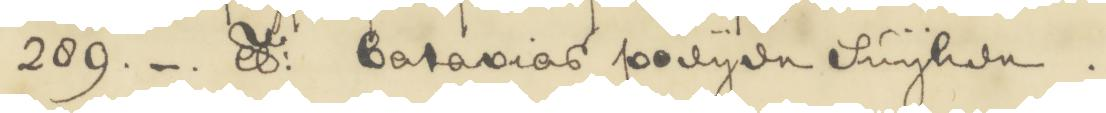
289. –. lb: batavias poeijer suijker
